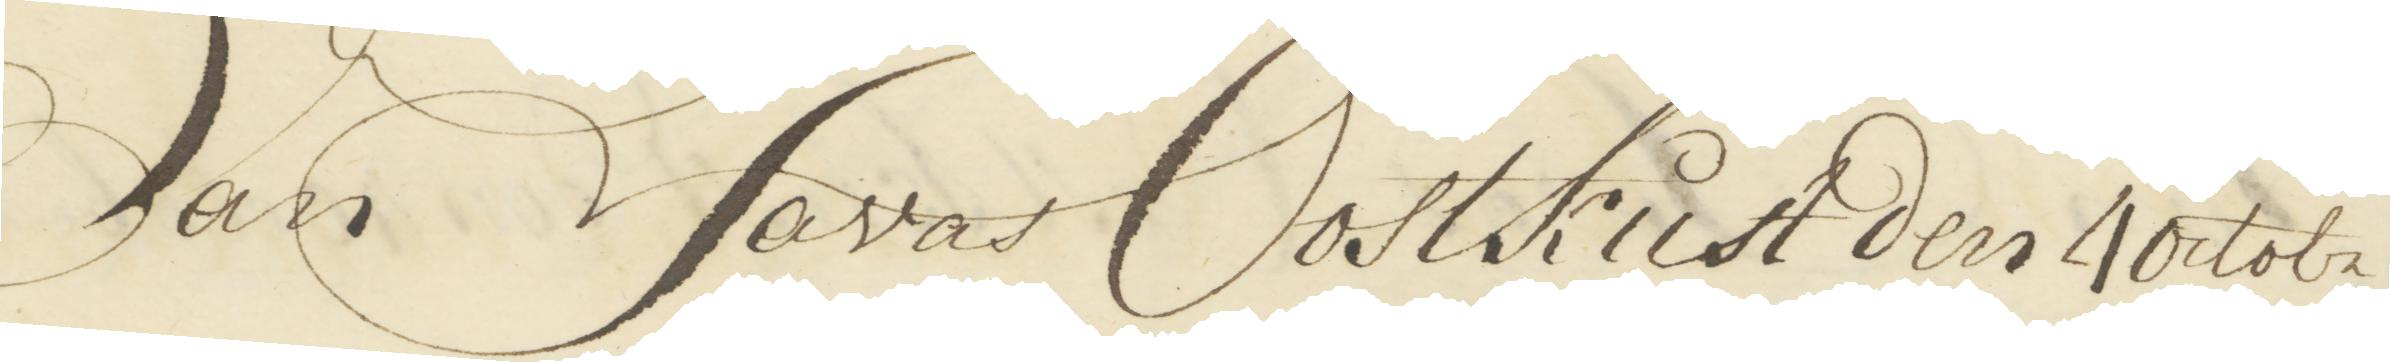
Van Javas Oostkust den 4 octobr
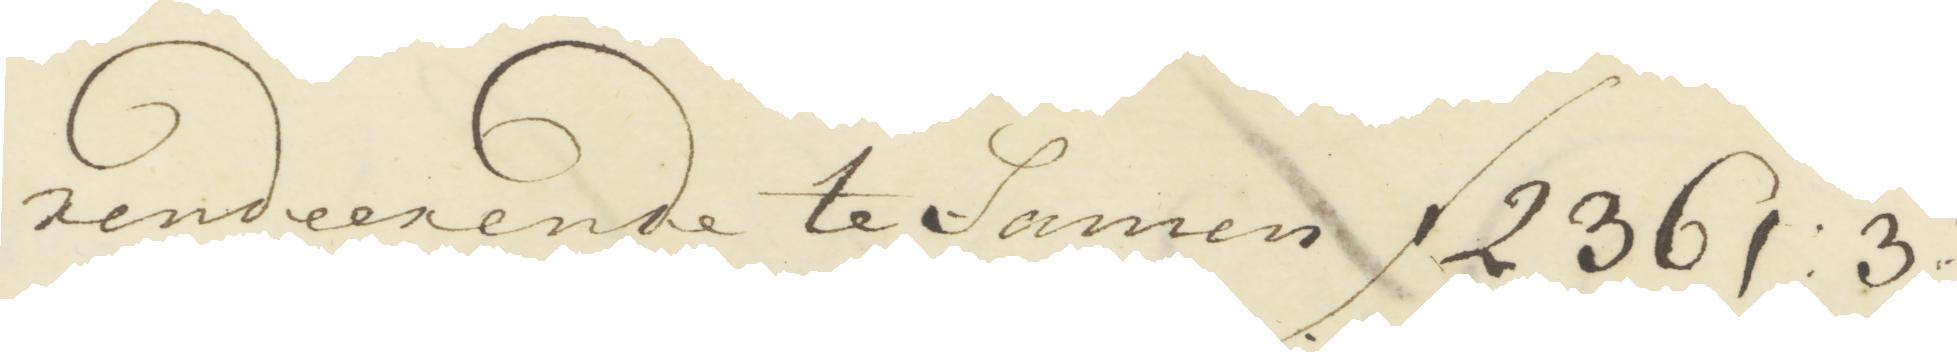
rendeerende te samen ƒ2361: 3:
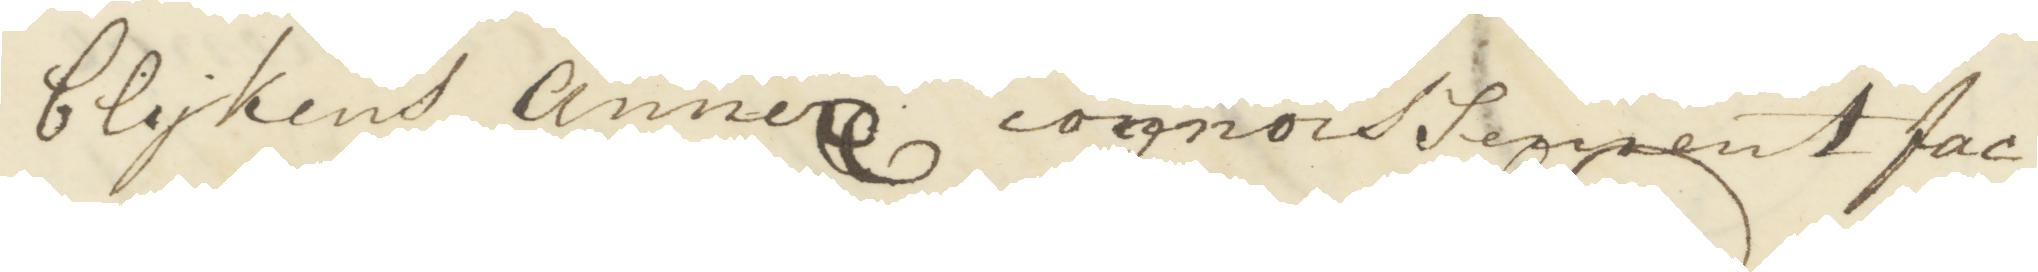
blijkens annex cognoissement fac
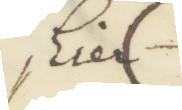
„ hier
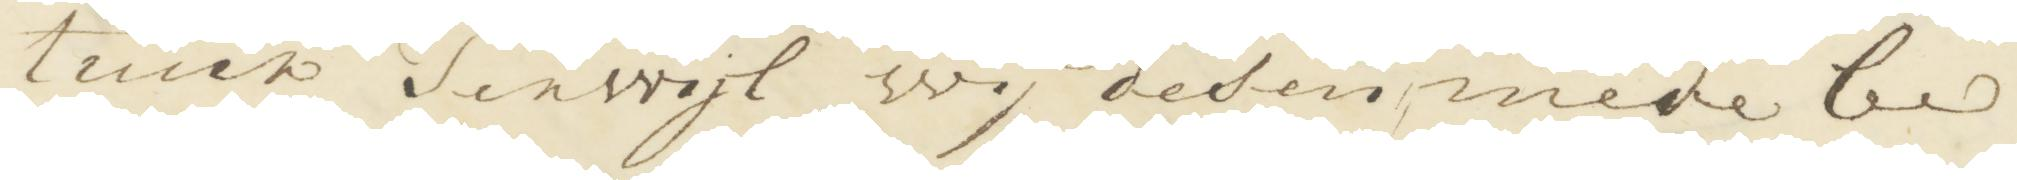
tuur Terwijl wij desen „ mede be
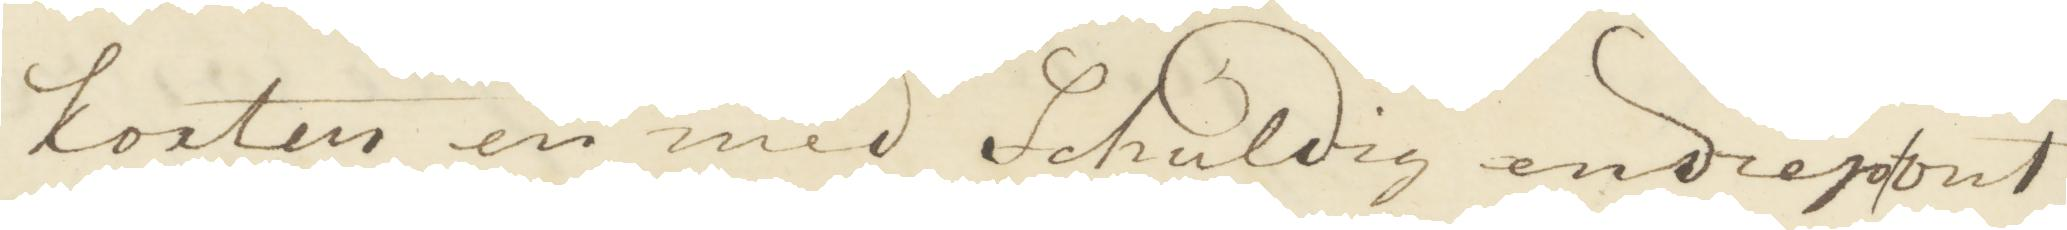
korten en med schuldig endiep/ont
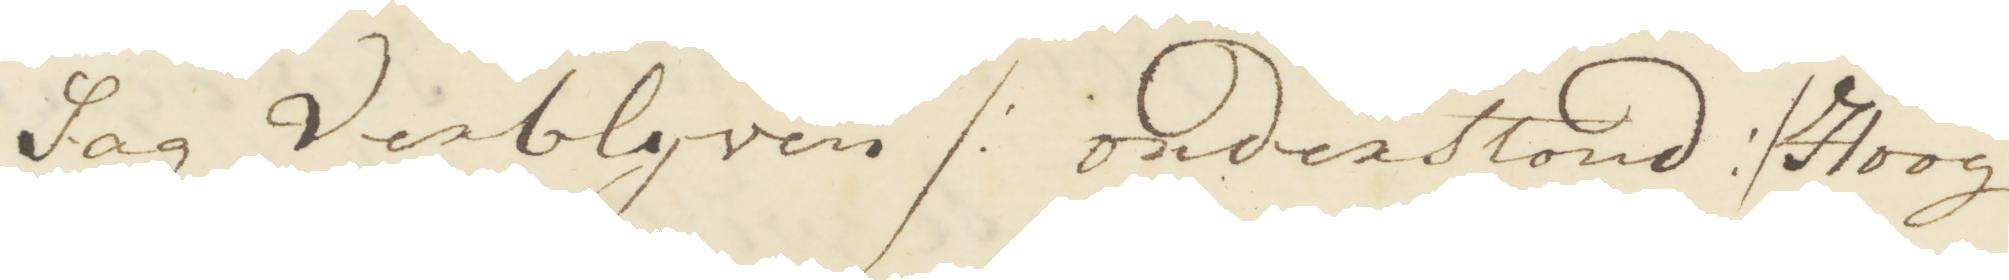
sag verblijven /: onderstond :/Hoog
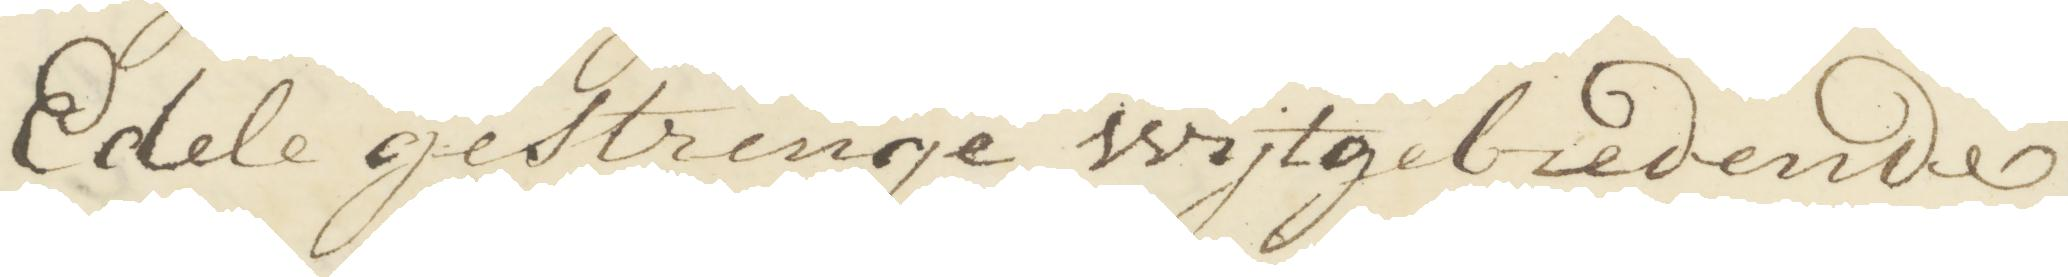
Edele gestrenge wijtgebiedende
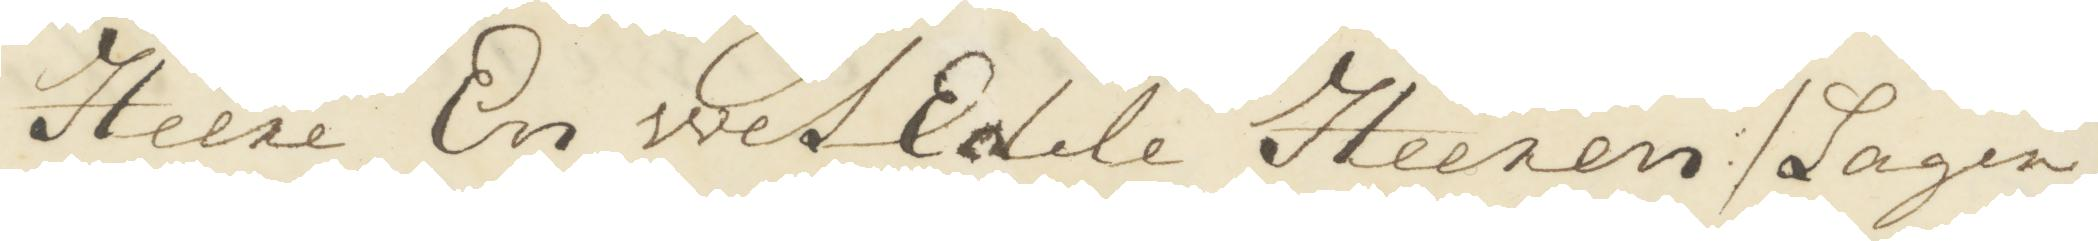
Heere En welEdele Heeren:/ Lager
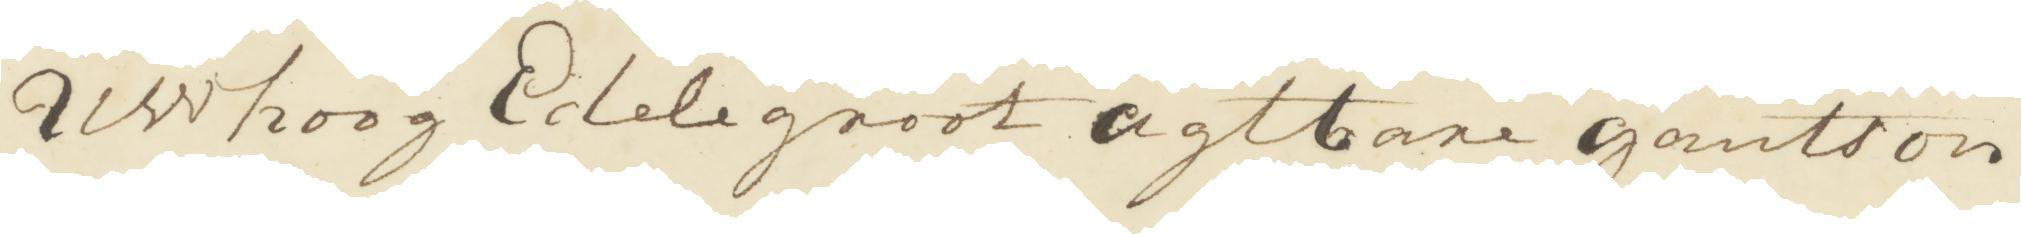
uw hoog Edele groot agtbare gants on
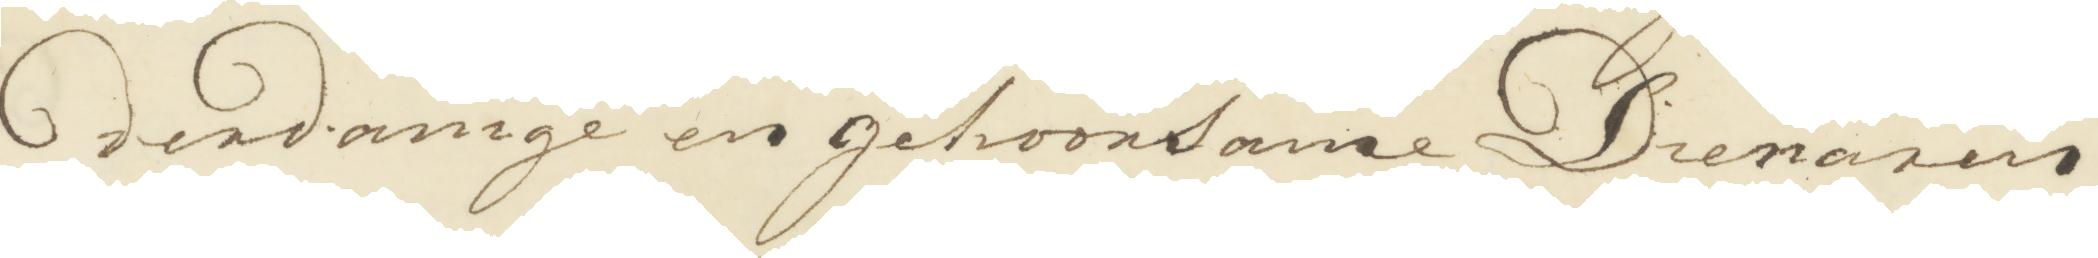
derdanige en gehoorsame Dienaren
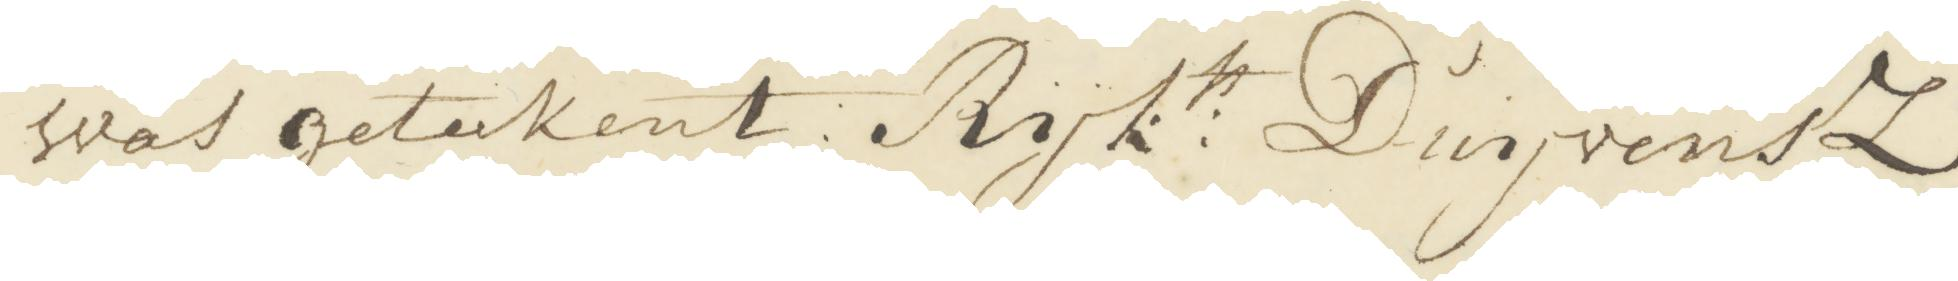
was getekent: Rijk:ff Duijvensz
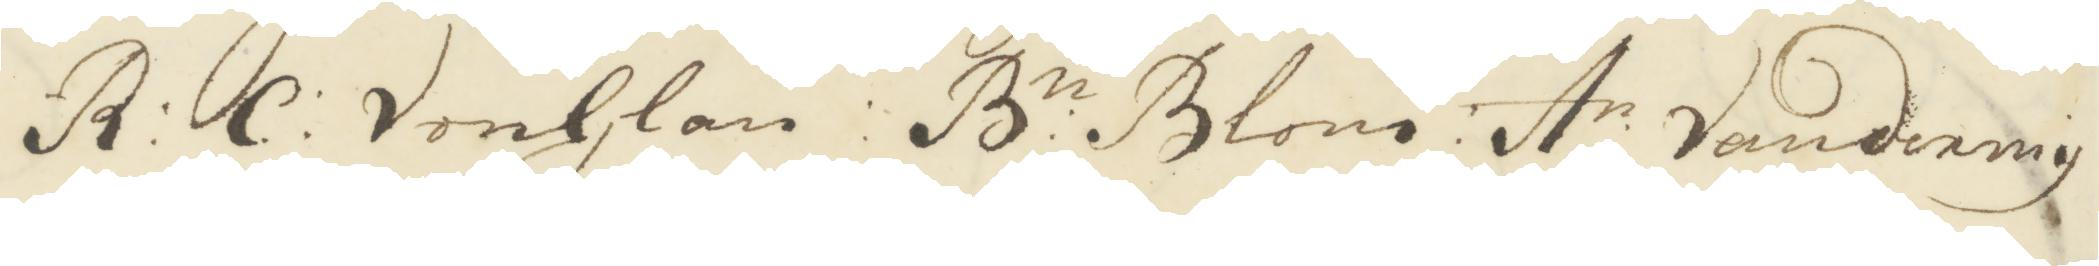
R: C: VonGlan: B:n Blom: A:n vandermij
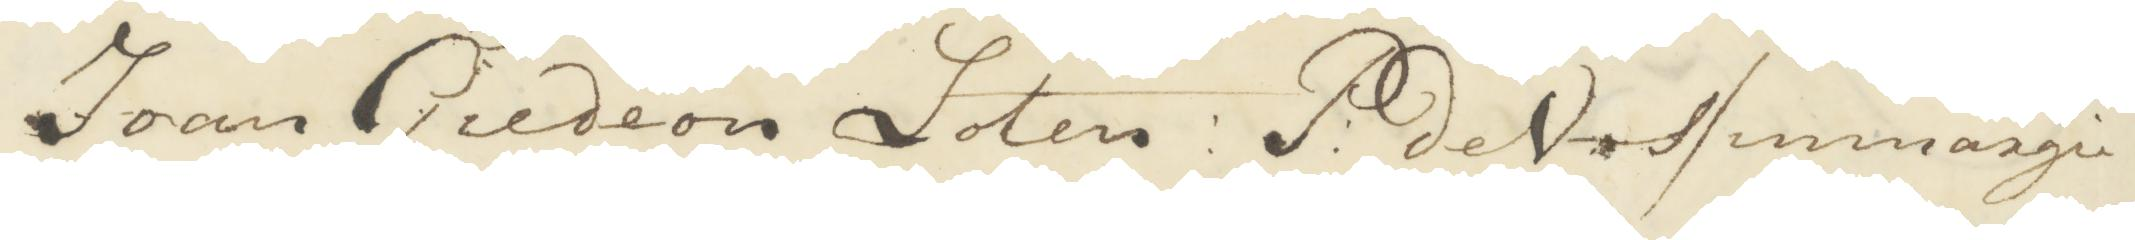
Ioan Giedeon Loten: P: de Vos/inmargie
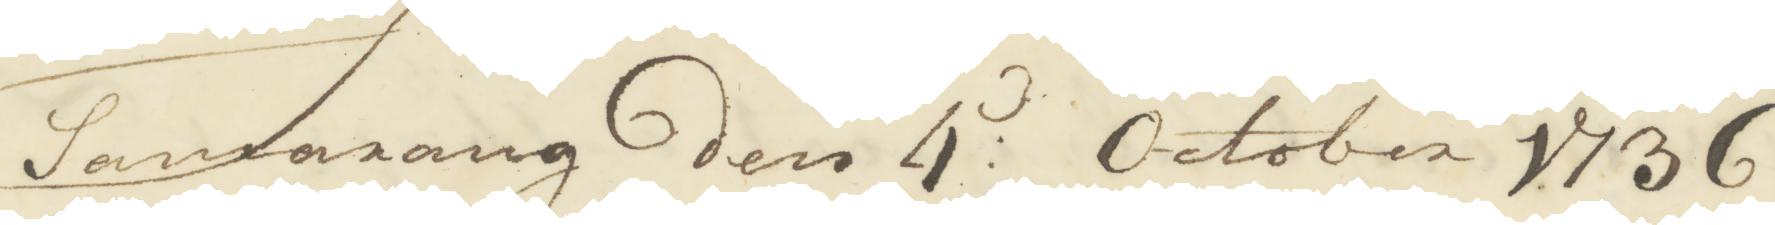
samarang den 4:' October 1736
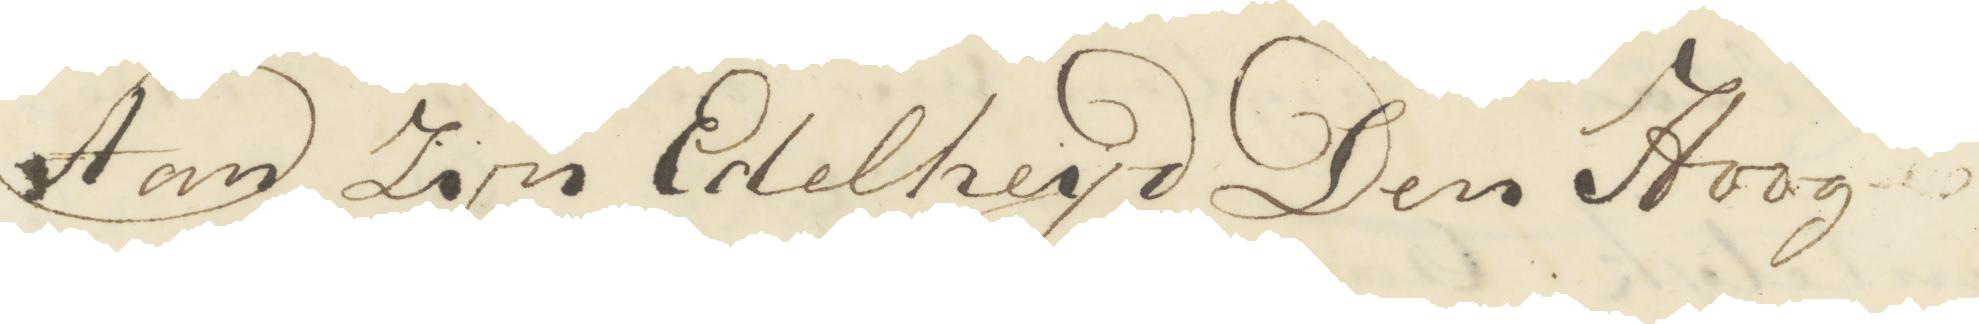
Aan zijn Edelheijd Den Hoog
